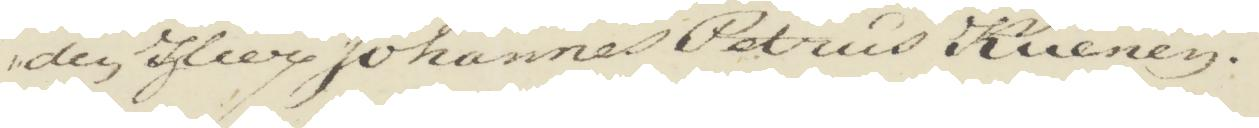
„den Heer Johannes Petrus Kuenen.
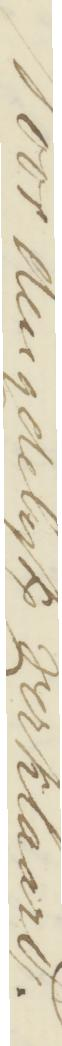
Voor deugdelijk verklaard.
